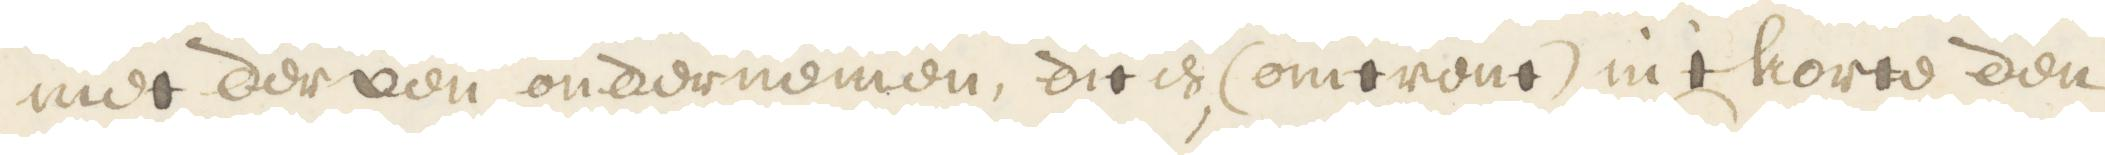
niet derven ondernemen, dit is (omtrent) in ’t korte den
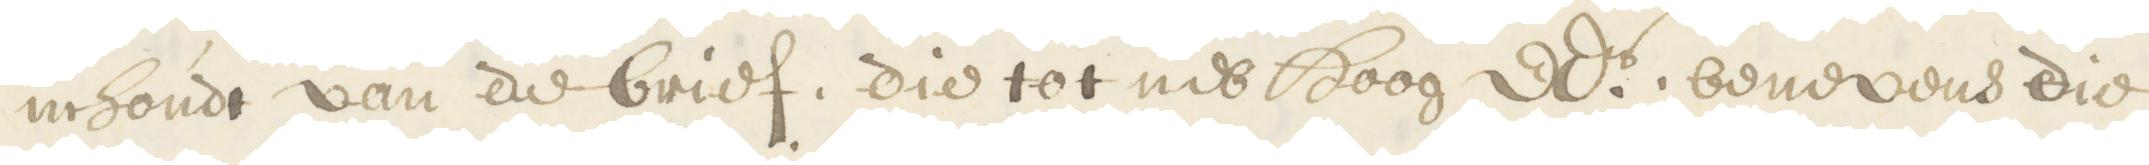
inhoudt van de brief, die tot uw Hoog Ed.s. benevens die
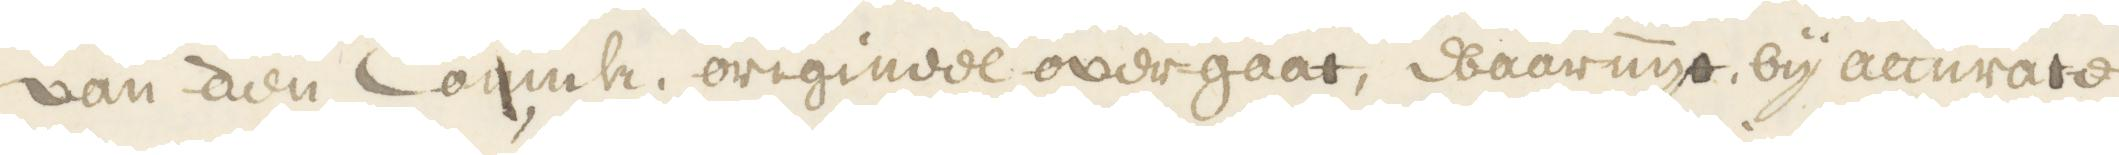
van den Conink, origineel overgaat, waaruijt, bij accurate
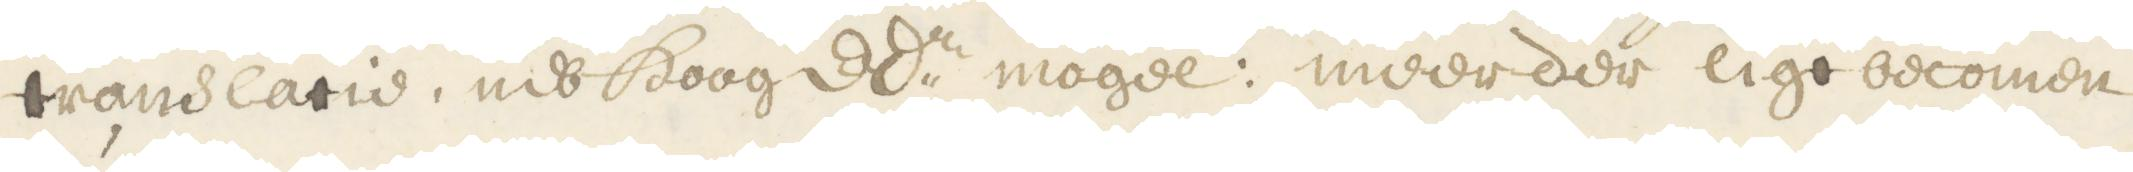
translatie, uw Hoog Ed„en mogel: meerder ligt becomen
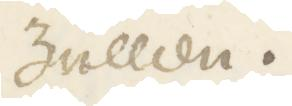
zullen.
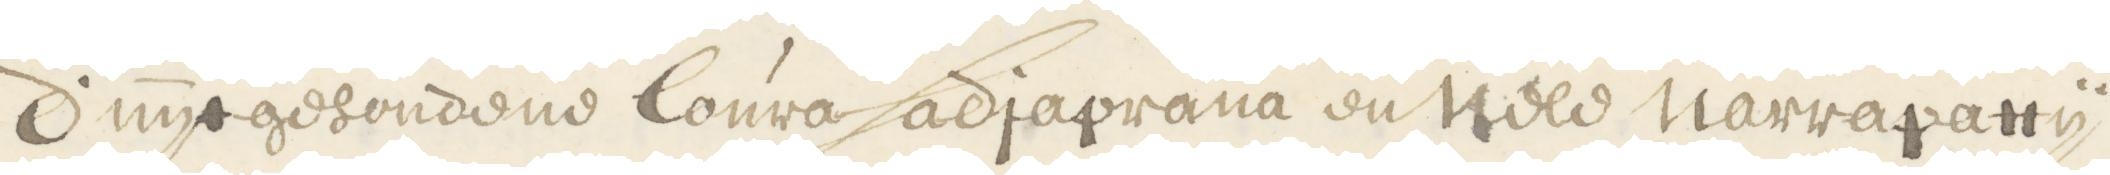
d'uijt gesondene Coura Sadjaprana en Nele Narrapattij
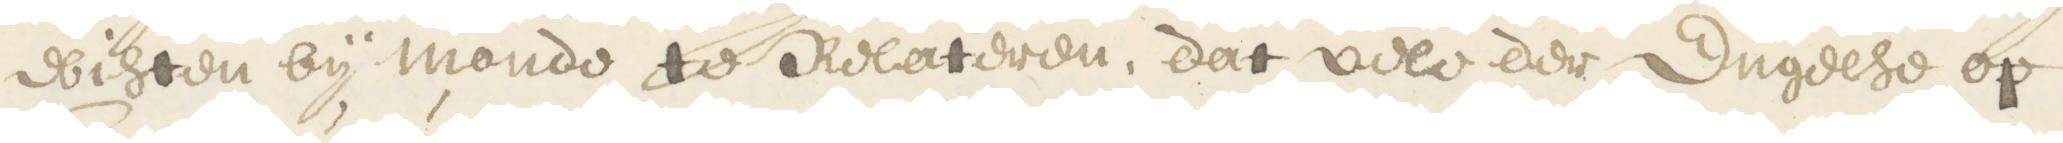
wisten bij monde te Relateren, dat vele der Engelse op
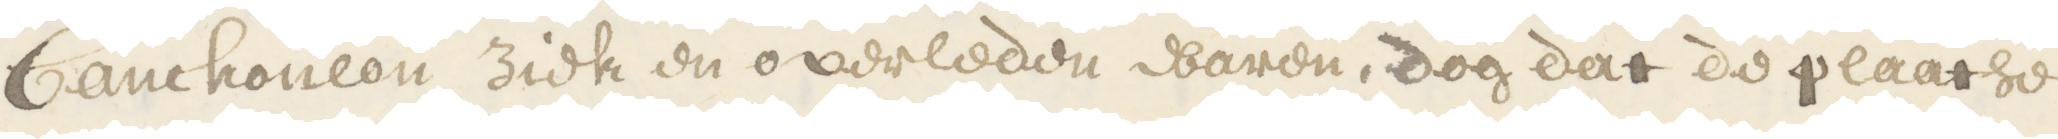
Banckoulou ziek en overleden waren, dog dat de plaatse
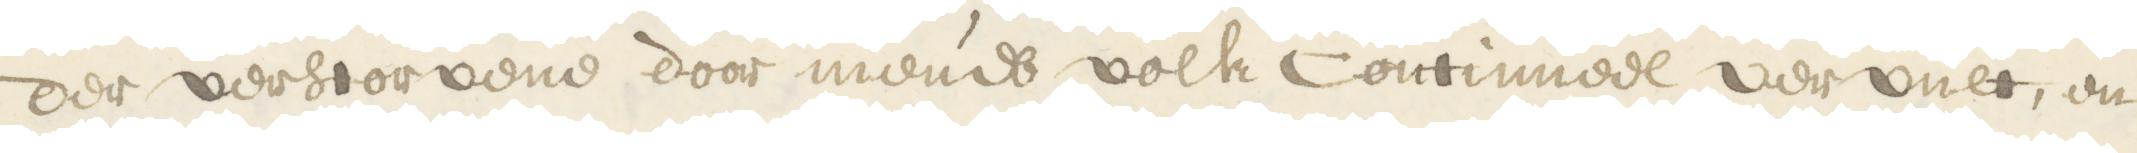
der verstorvene door nieuw volk Continueel vervult, en
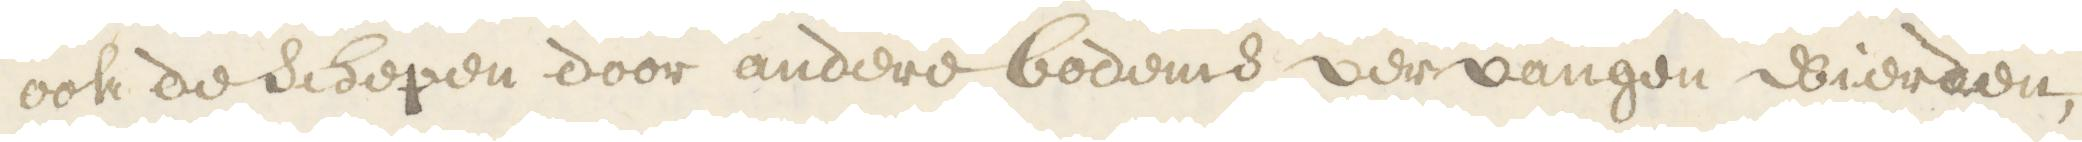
ook de schepen door andere bodems vervangen wierden,
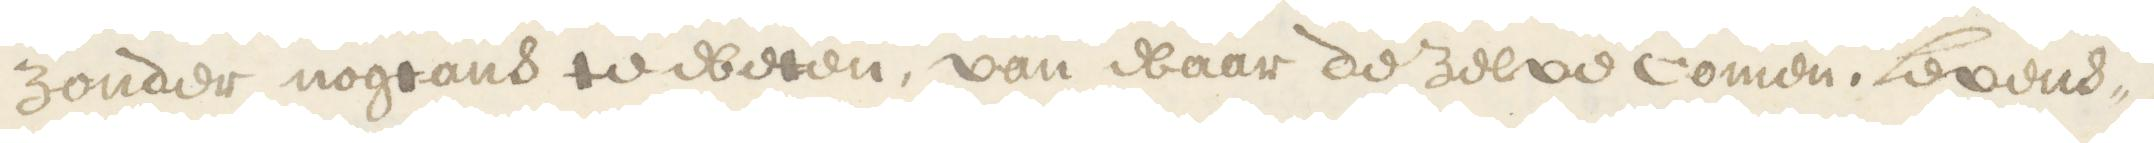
zouder nogtans te weten, van waar de zelve comen, levens„
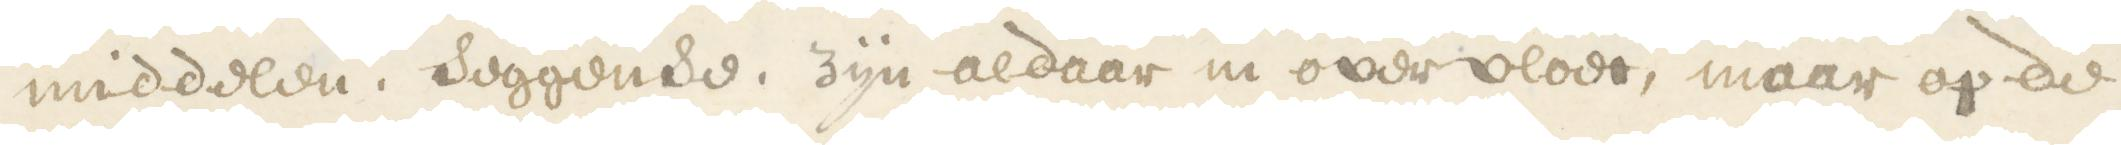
middelen, seggense, zijn aldaar in over vloet, maar op de
